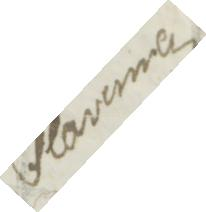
slavinnen
